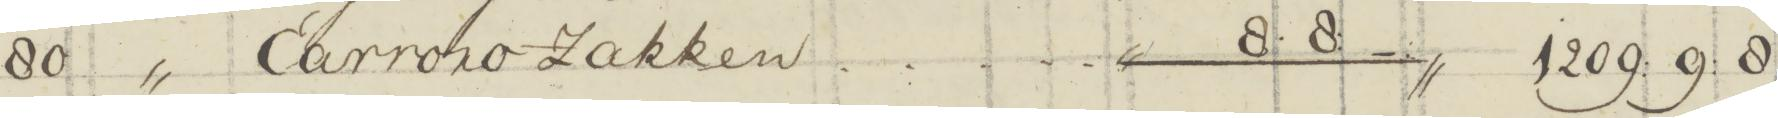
80 „ Carroro Zakken . . . - -„ 8: 8:—: „ 1209: 9: 8
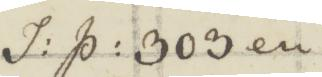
I: p: 303 en
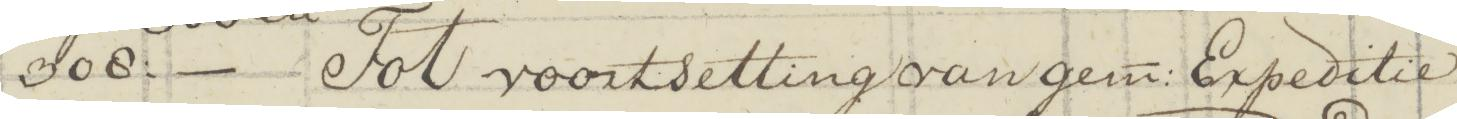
308:— Tot voortsetting van gem: Expeditie
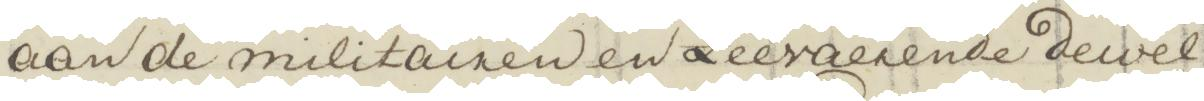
aan de militairen en zeevaerende dewel
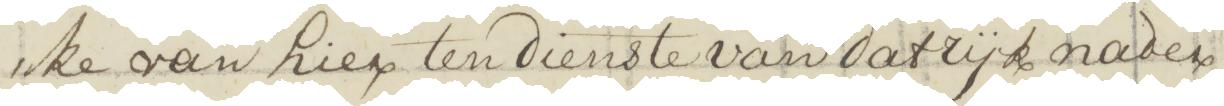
„ke van hier ten dienste van dat rijk nader
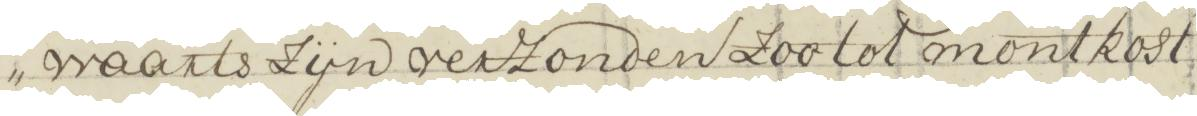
„waarts zijn verzonden zoo tot mont kost
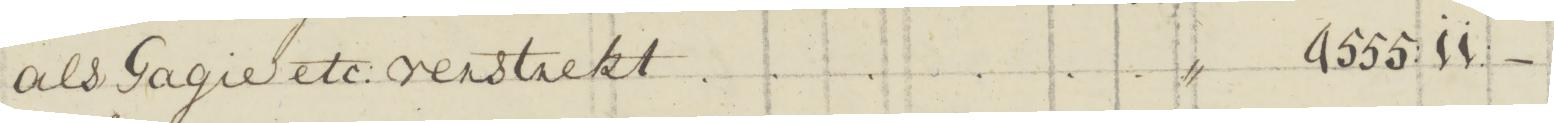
als Gagie etc: verstrekt . . . . . . „ 4555:11:—
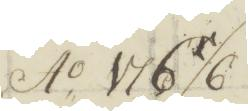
A„o 176 5/6
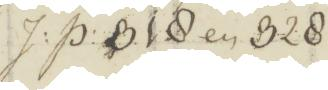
J: p: 318 en 328
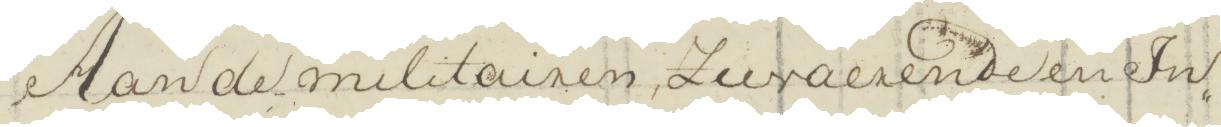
Aan de militairen, Zeevaerende en In„
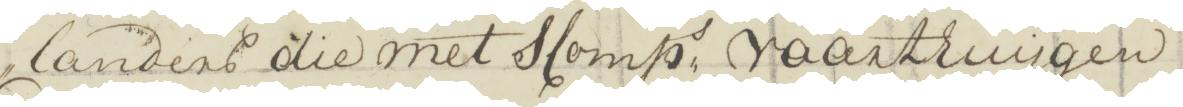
„landers die met sComp„s vaarthuijgen
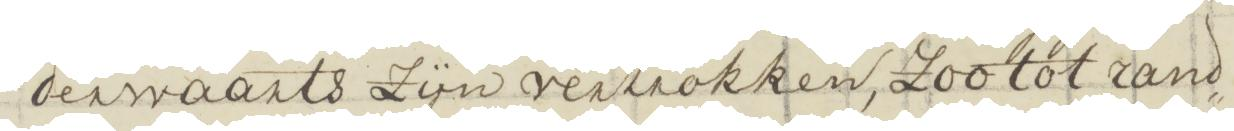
derwaarts zijn vertrokken, zoo tot rand„
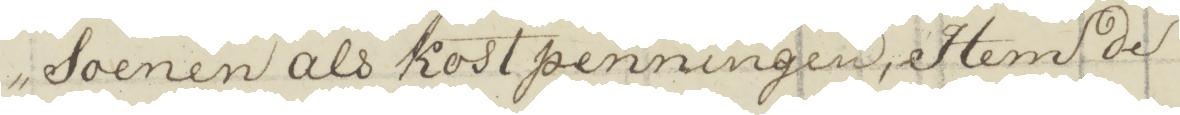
„soenen als kost penningen, Item de
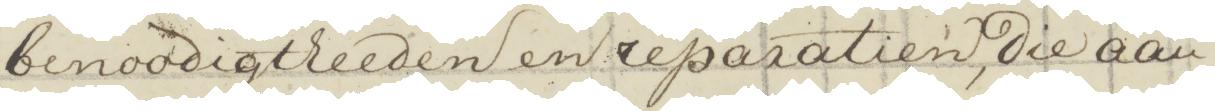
benoodigtheeden en reparatien, die aan
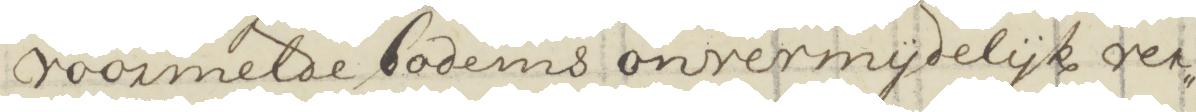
voormelde bodems onvermijdelijk ver„
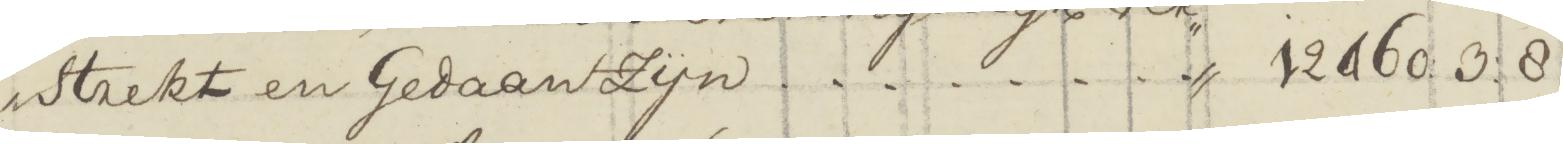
„strekt en Gedaan zijn . - - - - - . .„ 12460: 3: 8
